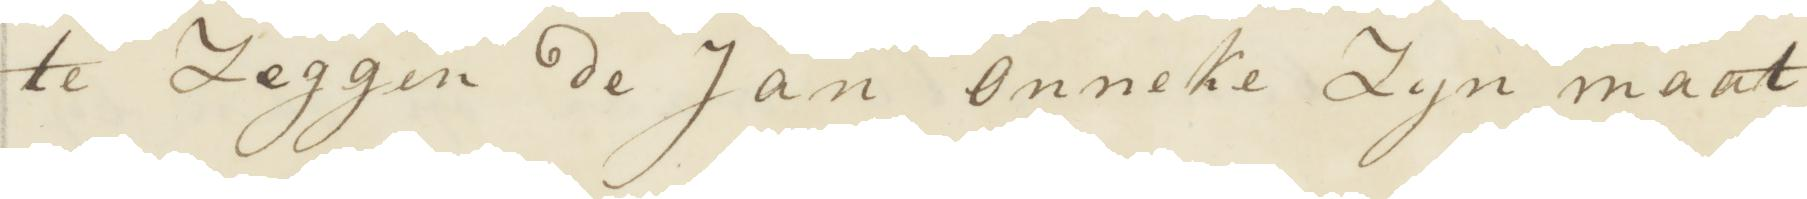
te zeggen de Jan onneke zyn maat
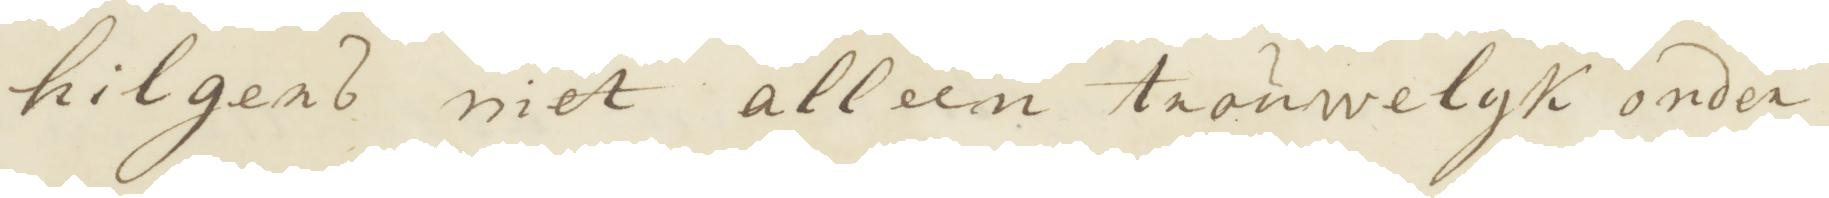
hilgers niet alleen trouwelyk onder
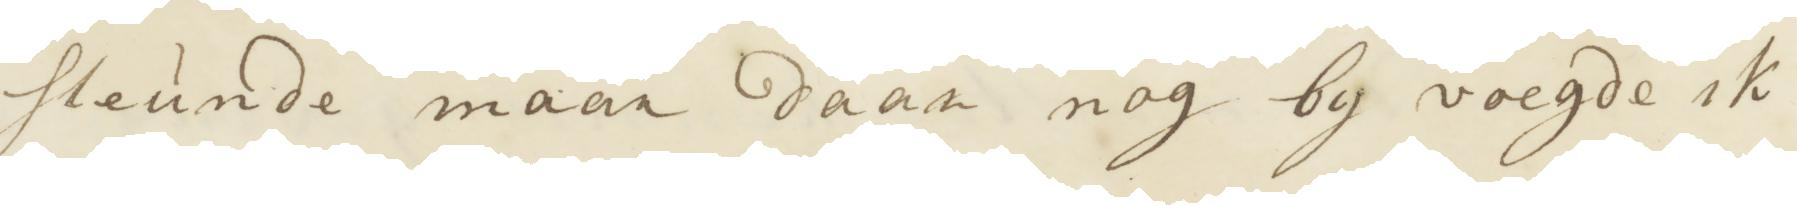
steunde maar daar nog by voegde ik
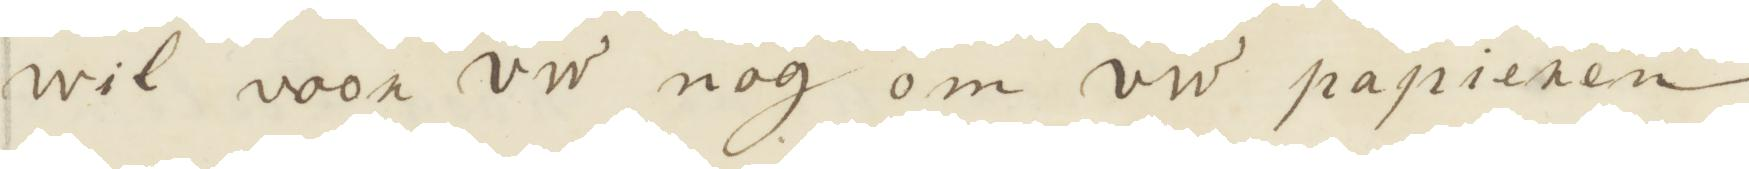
wil voor vw nog om vw papieren
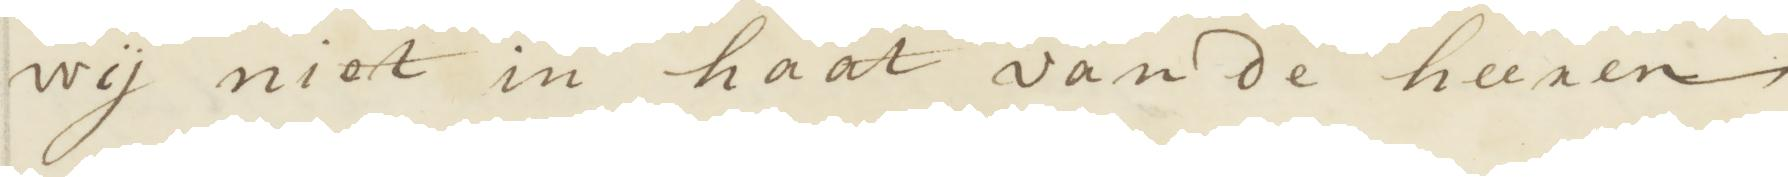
wij niet in haat van de heeren
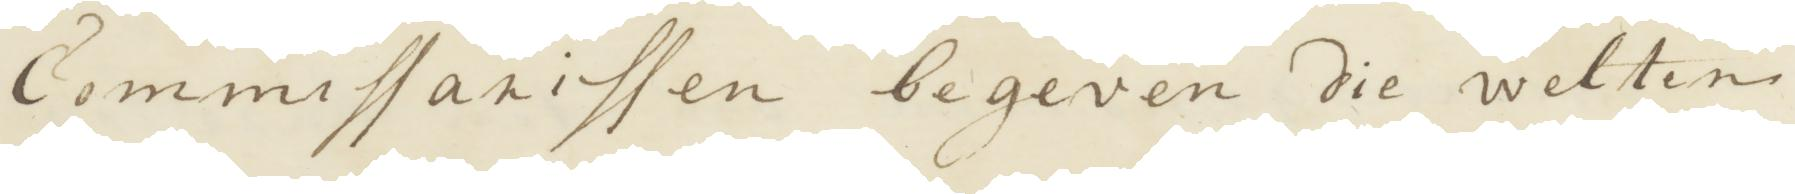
Commissarissen begeven die wel ten
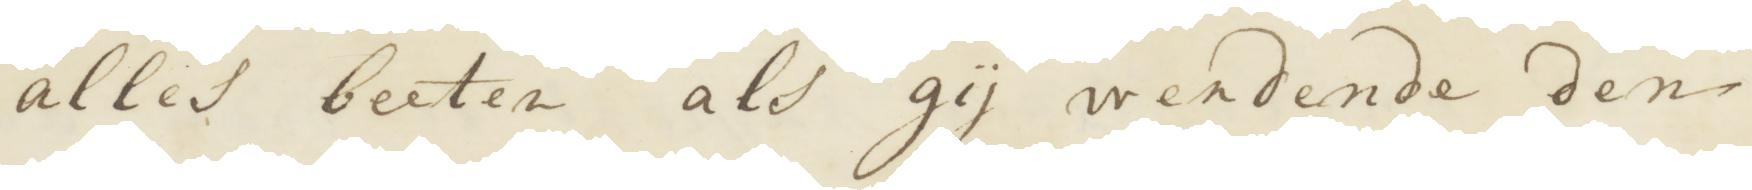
alles beeter als gij werdende den
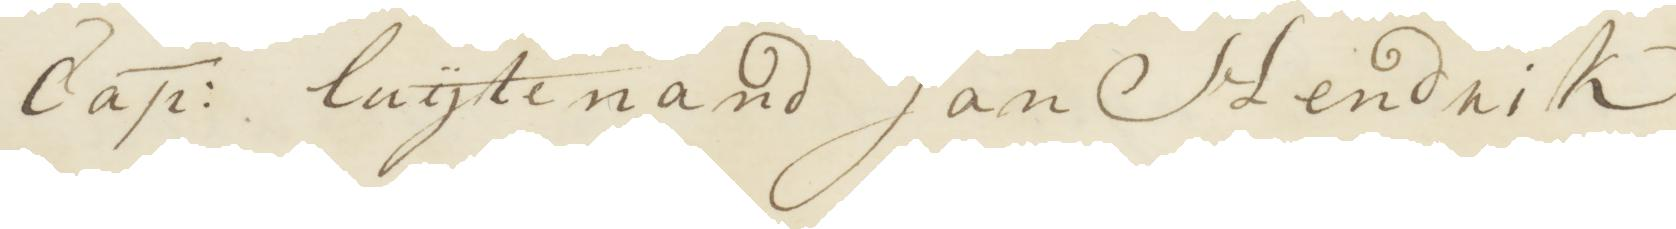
Cap: luijtenand Jan Hendrik
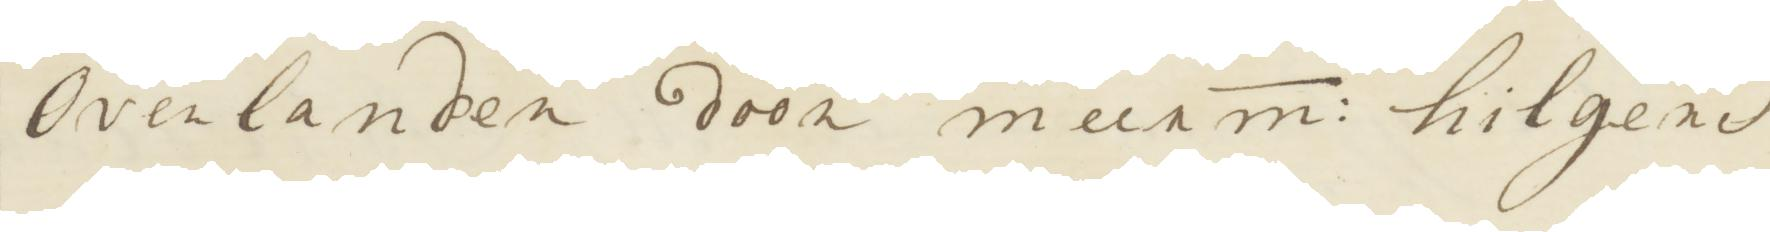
Overlander door meerm: hilgers
